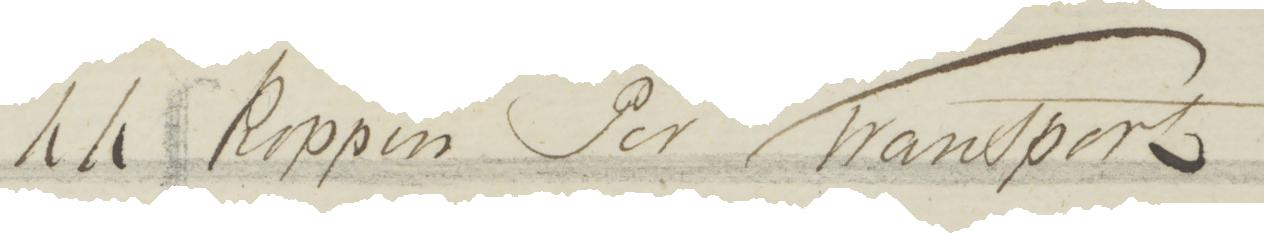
44 koppen Per Transport
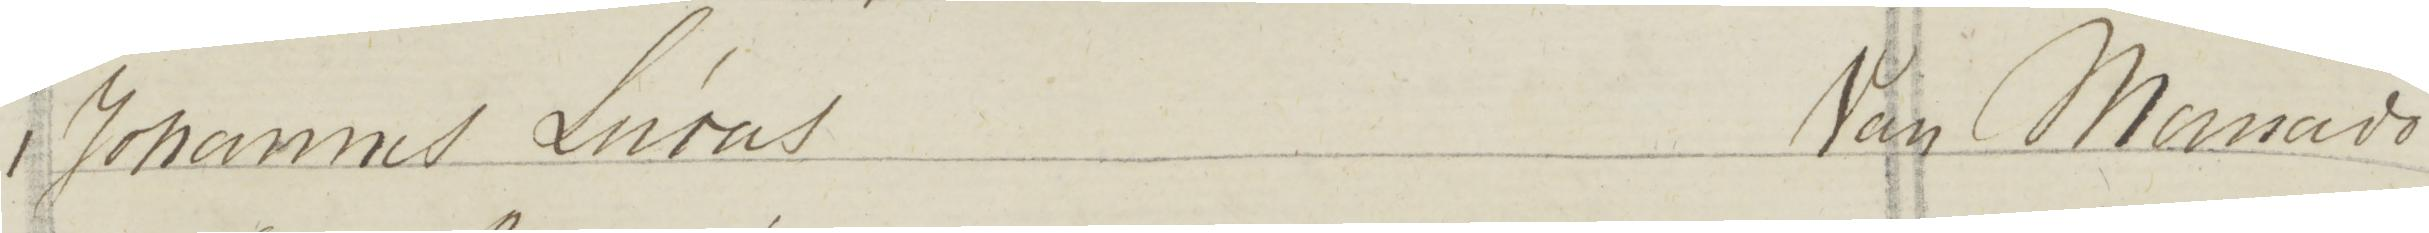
1 Johannes Lucas Van Manado
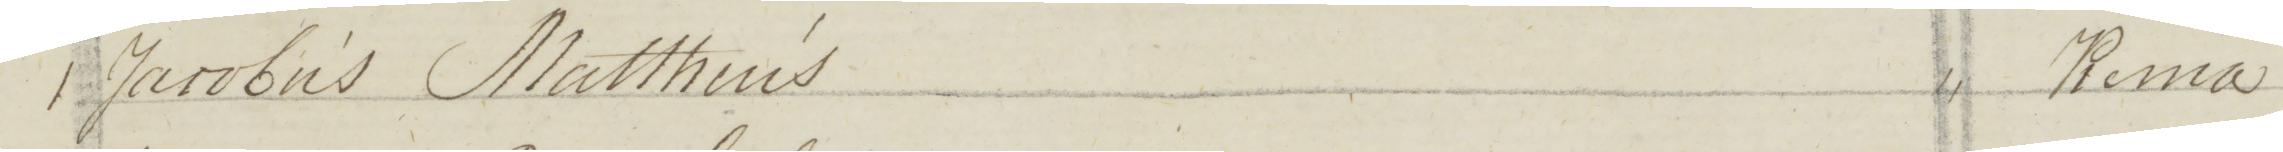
1 Jacobus Matthius „ Kema
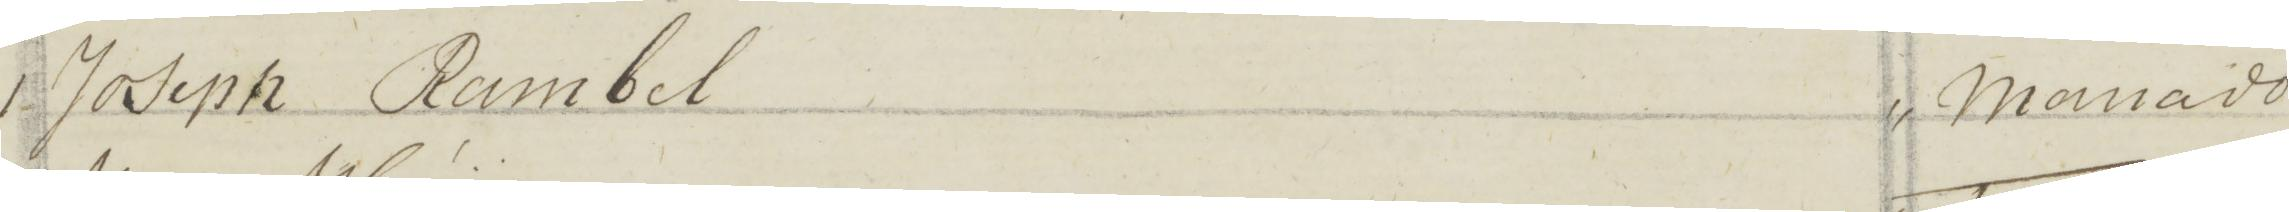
1 Joseph Rambel „ Manado
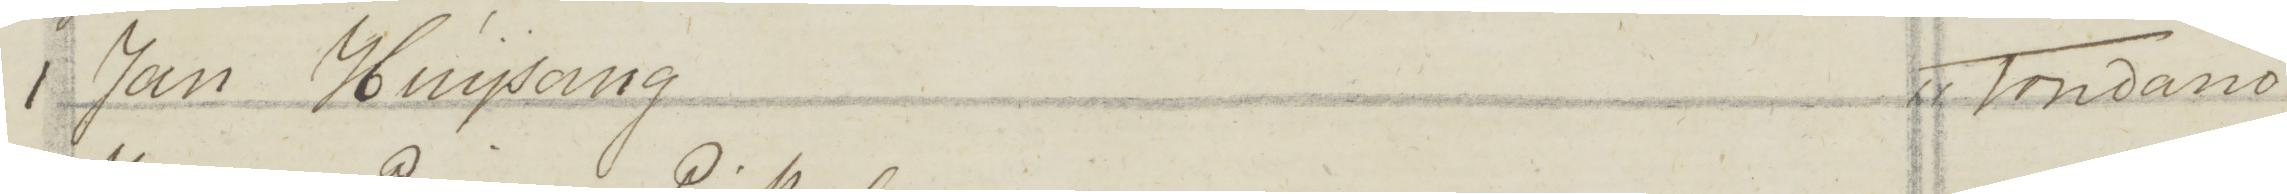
1 Jan Huijsang „ Tondano
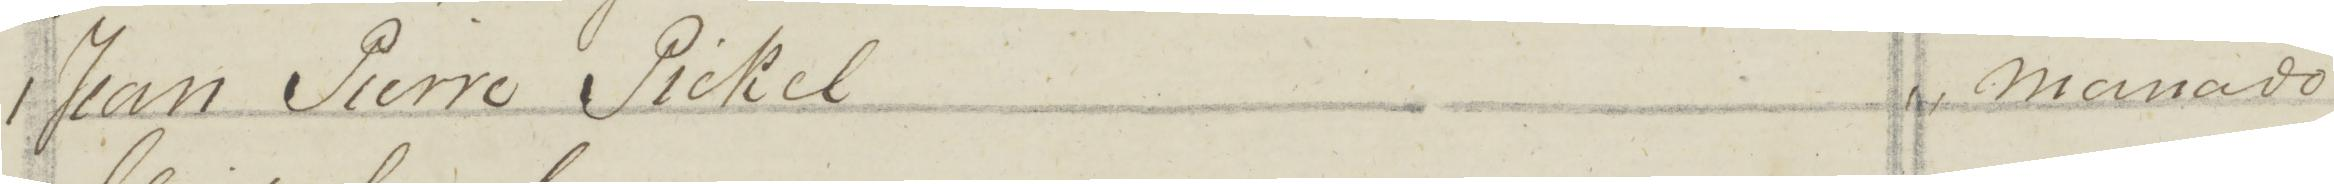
1 Jean Pierre Pickel „ Manado
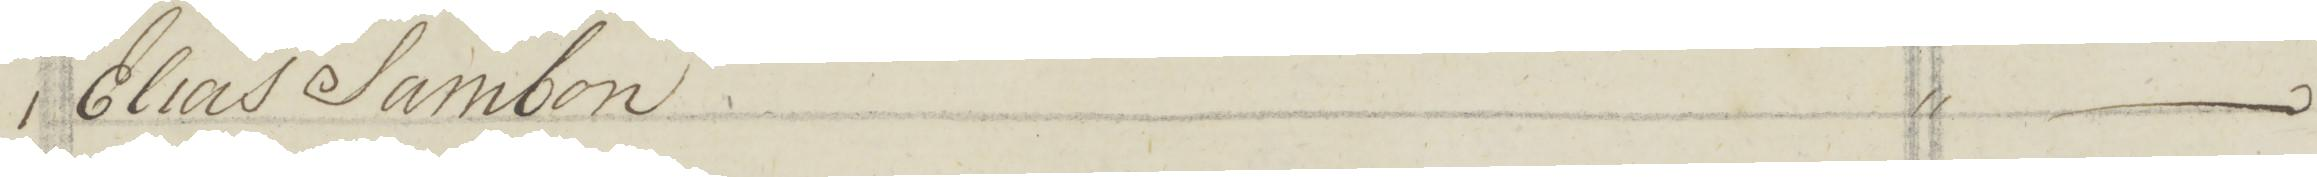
1 Elias Sambon „ —:'
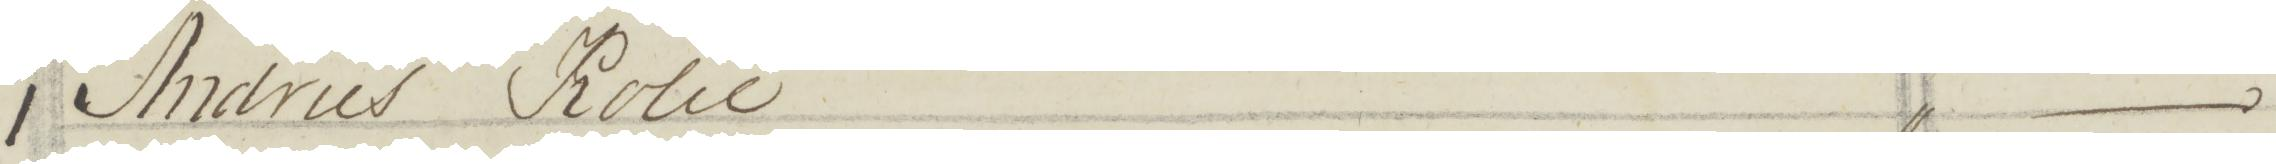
1 Andries Kolie „ —"
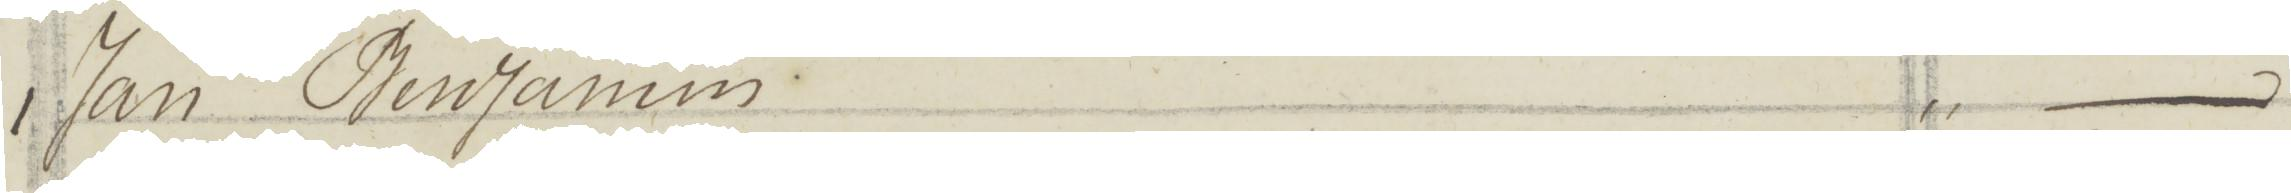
1 Jan Benjamin „ —"
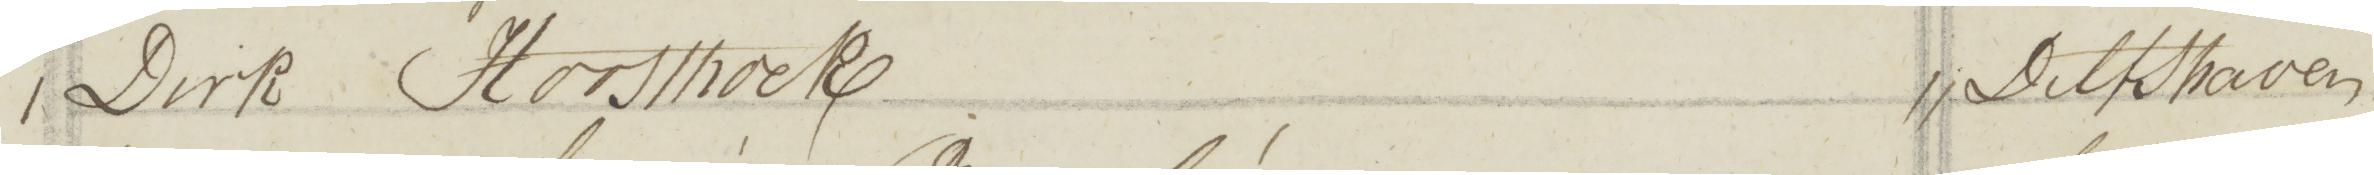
1 Dirk Horsthoek „ Delfshaven
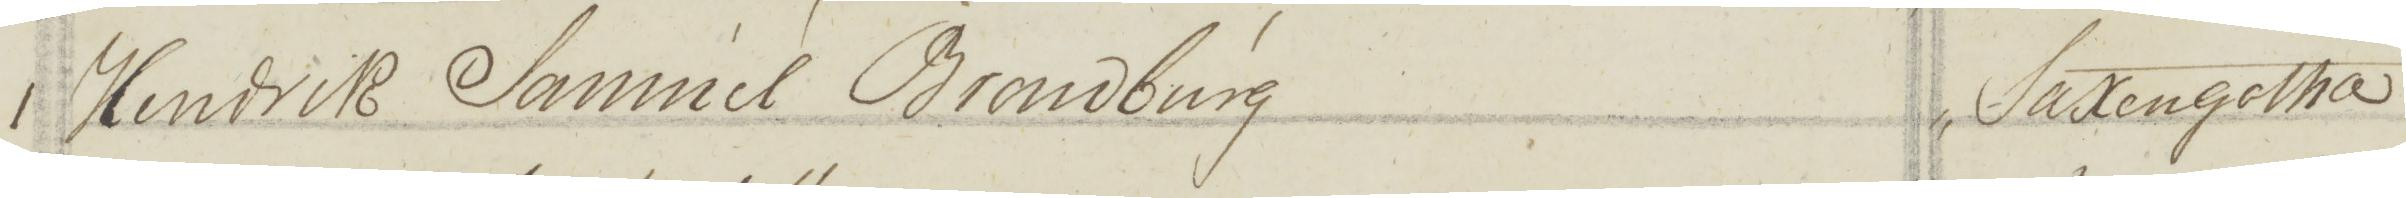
1 Hendrik Samuel Brandburg „ Saxengotha
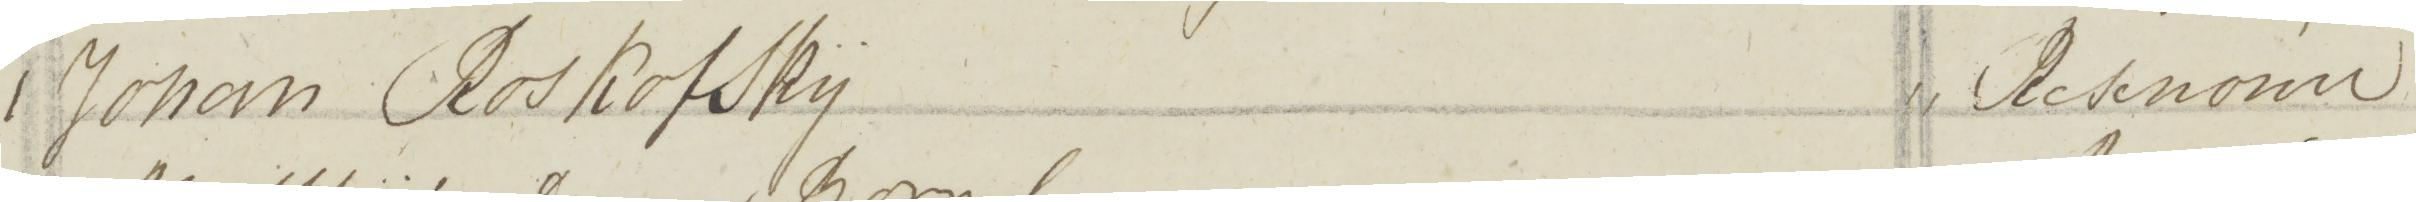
1 Johan Roskofskij „ Resenouw
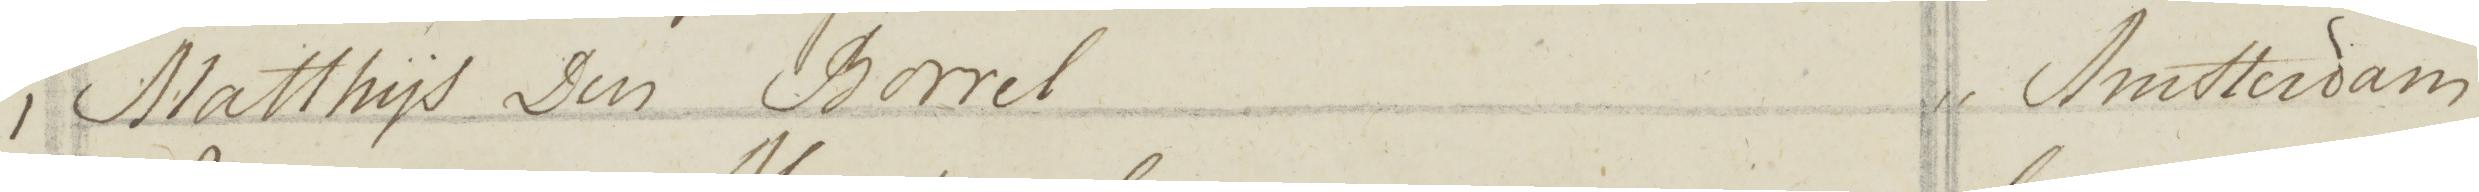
1 Matthijs Den Borrel „ Amsterdam
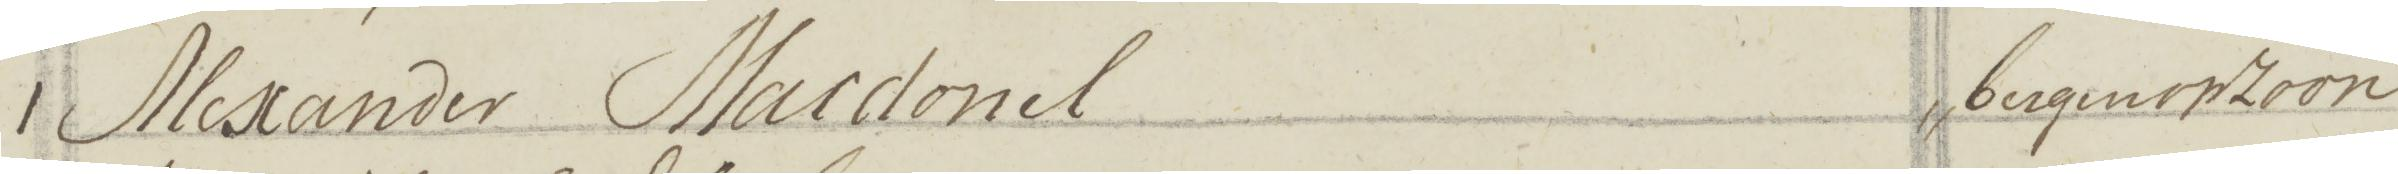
1 Alexander Macdonel „ bergen op zoon
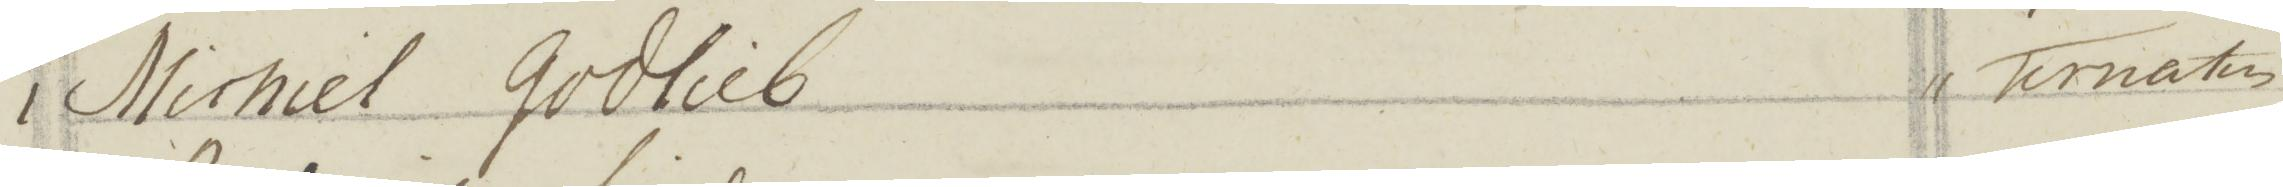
1 Michiel Godlieb „ Ternaten
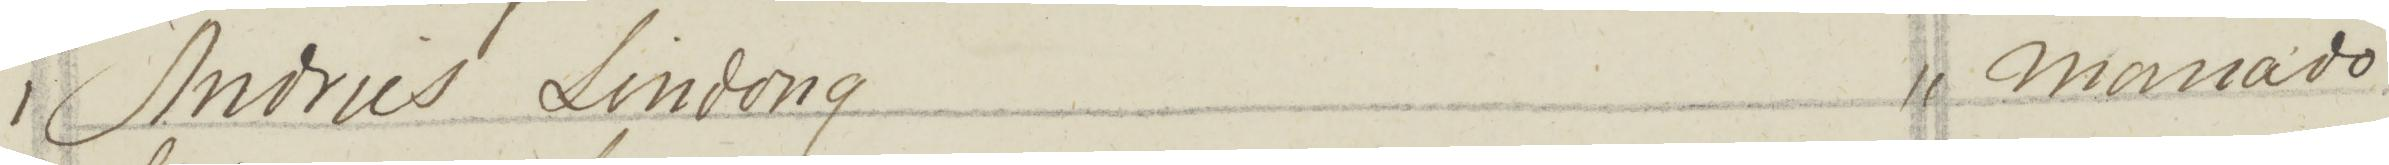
1 Andries Lindong „ Manado
